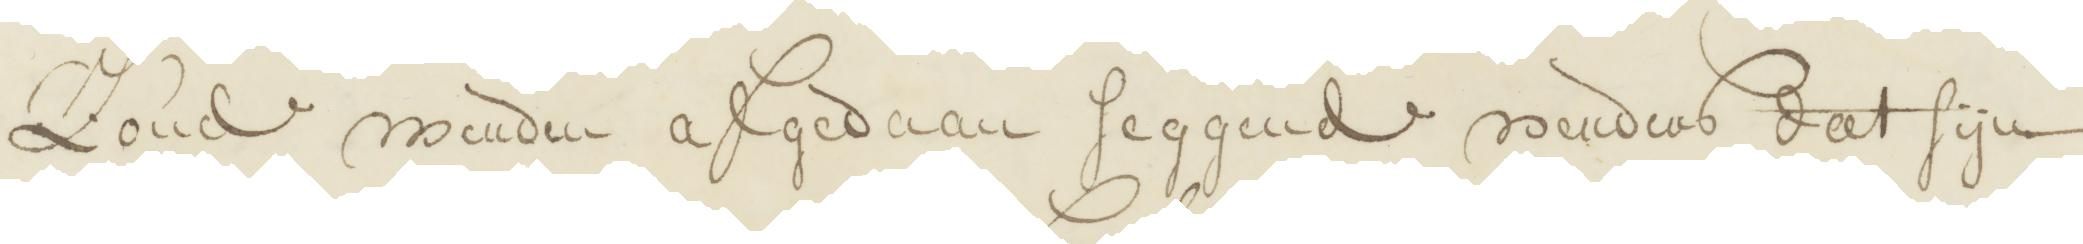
zoude werden afgedaan seggende verders dat sijn
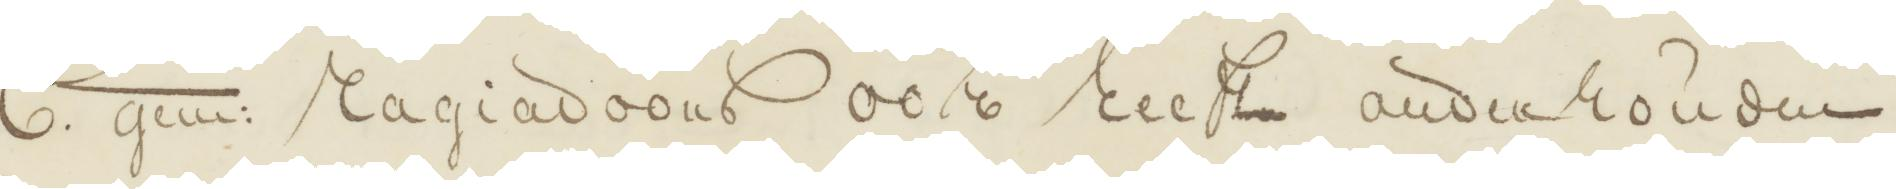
E. gem: ragiadoors ook heeft onderhouden
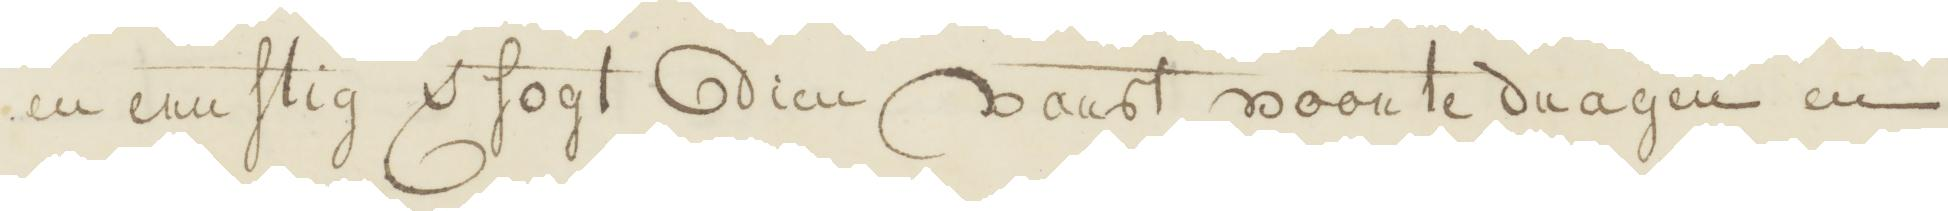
en ernstig versogt dien vorst voor te dragen en
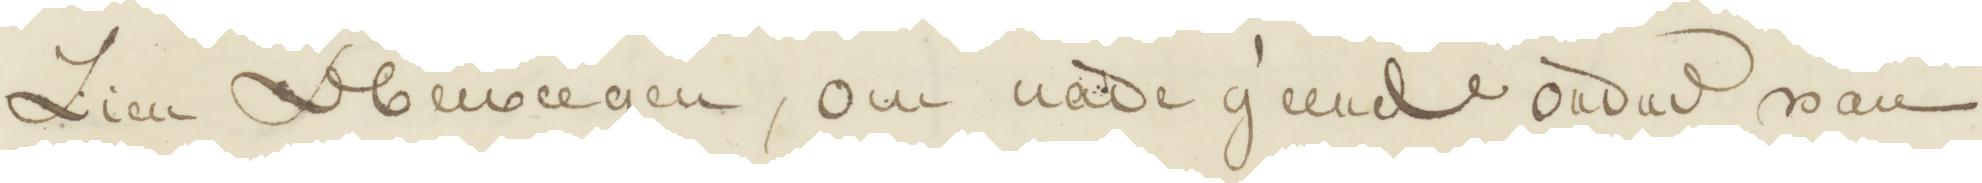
zien tebeweegen, om nade g'eerde ordre van
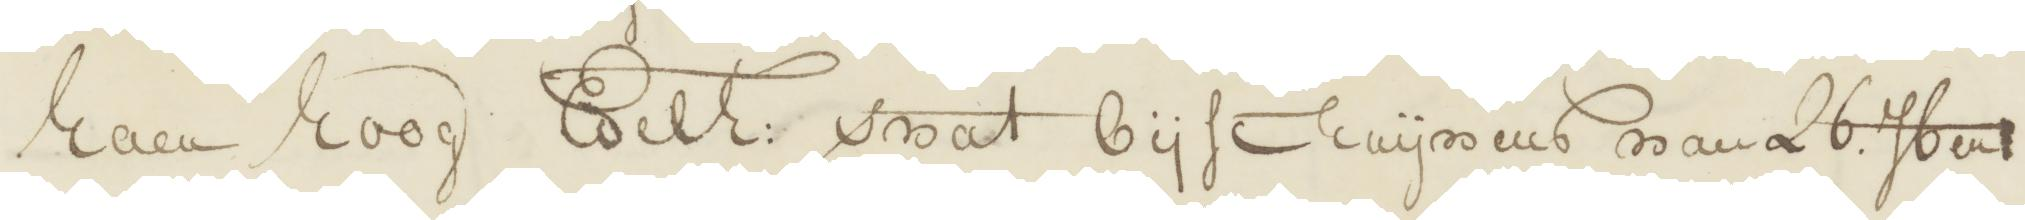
haer hoog Edelh: vervat bij schrijvens van 26. Jber
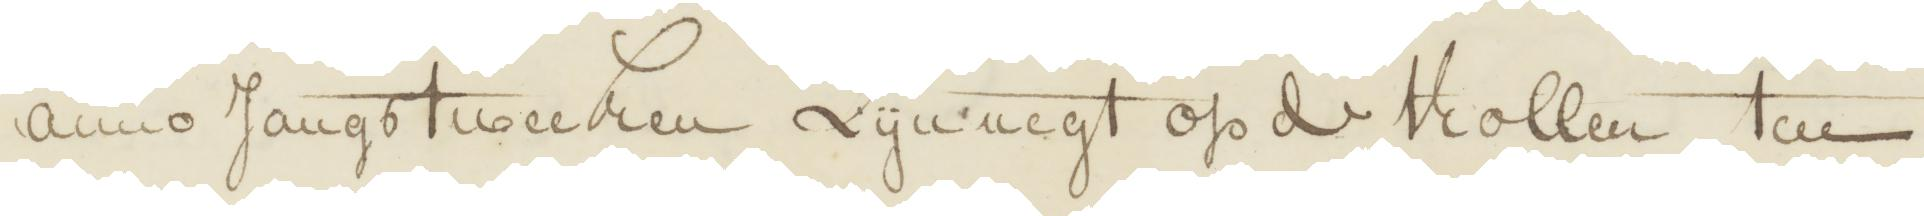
anno Jongstweeken zijn regt op de thollen ten
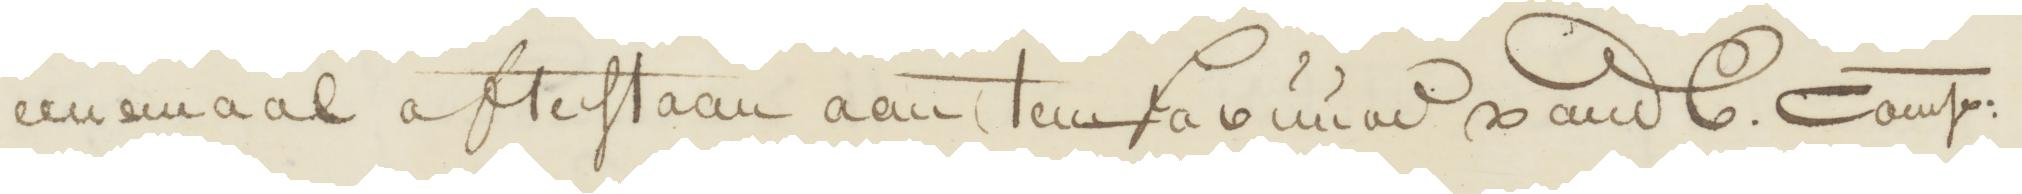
eenemaal aftestaan aan ten favuure vandE. comp:
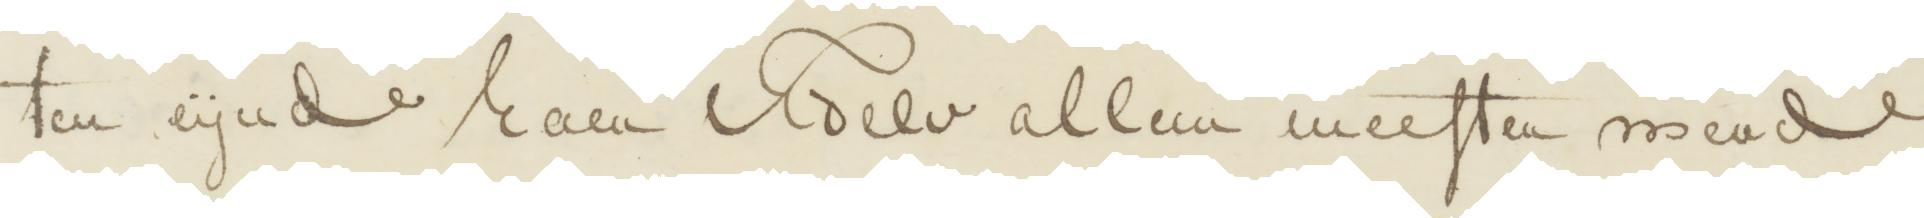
ten eijnde haer Edele alleen meester werde
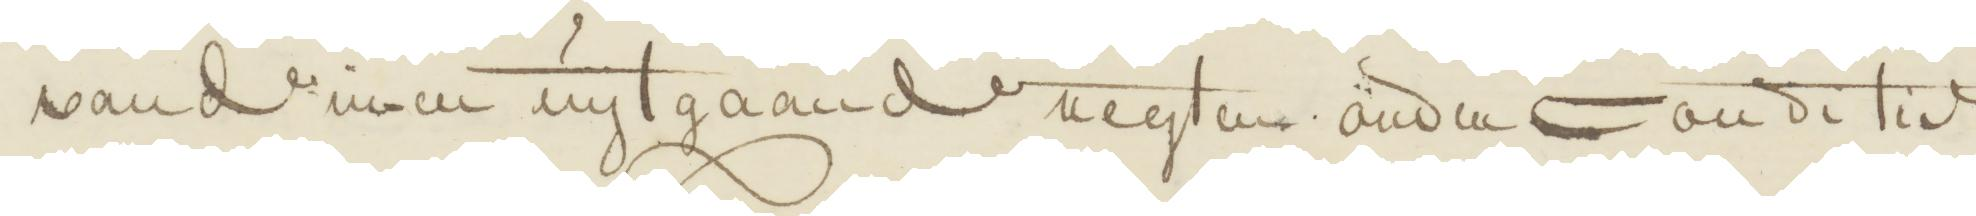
van de in en uijtgaande regten onder conditie
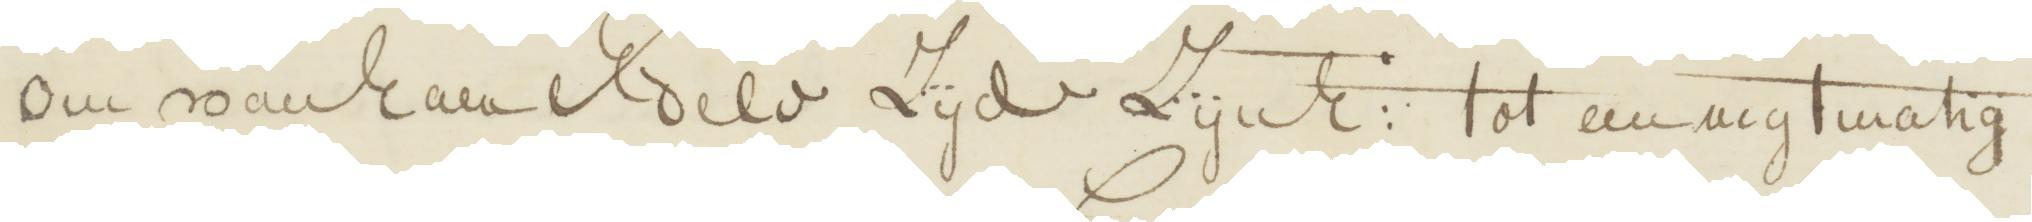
om van haer Edele zijde zijnh:t tot een regtmatig
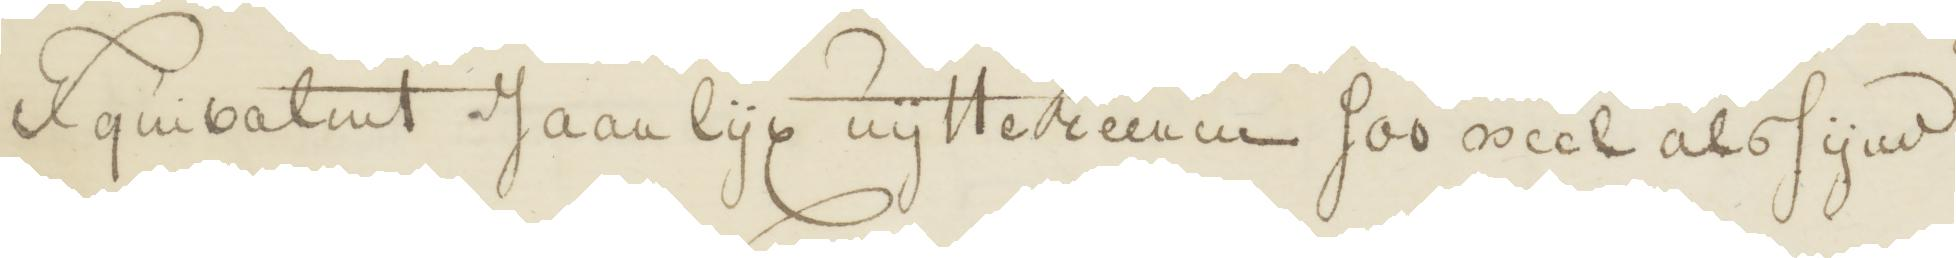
Equivalent Jaarlijx uijttekeeren soo veel als sijne
